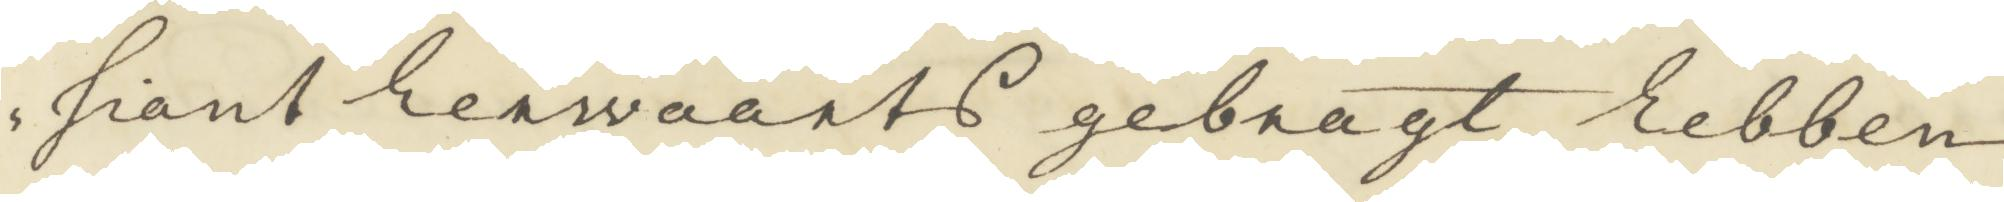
„siant herwaarts gebragt hebben
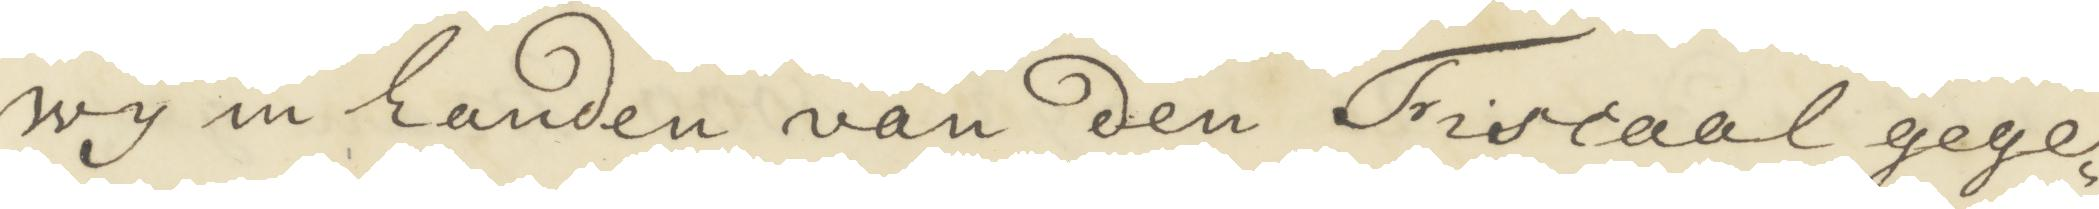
wij in handen van den Fiscaal gege„
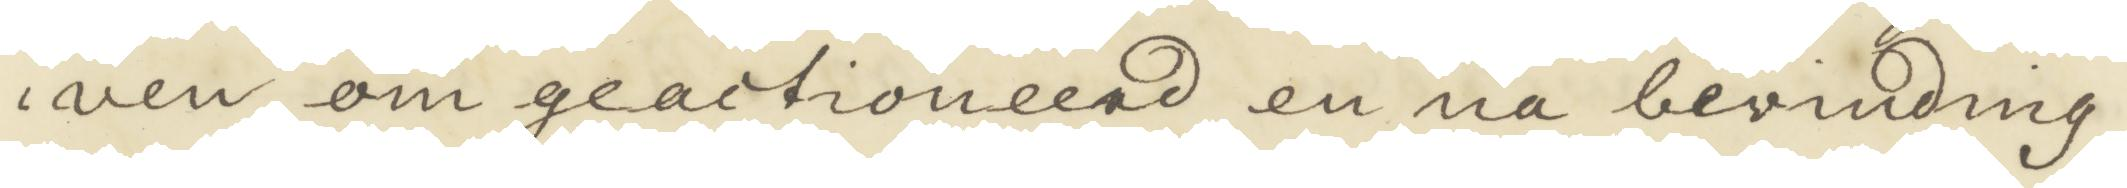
„ven, om geactioneerd en na bevinding
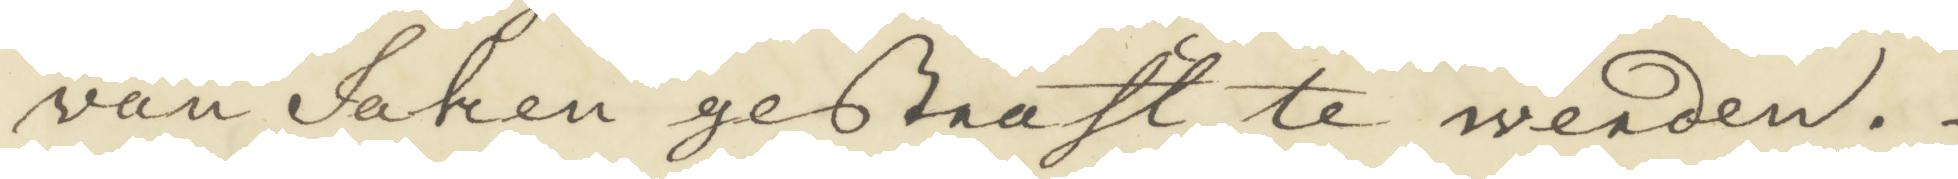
van Saken gestraft te werden.
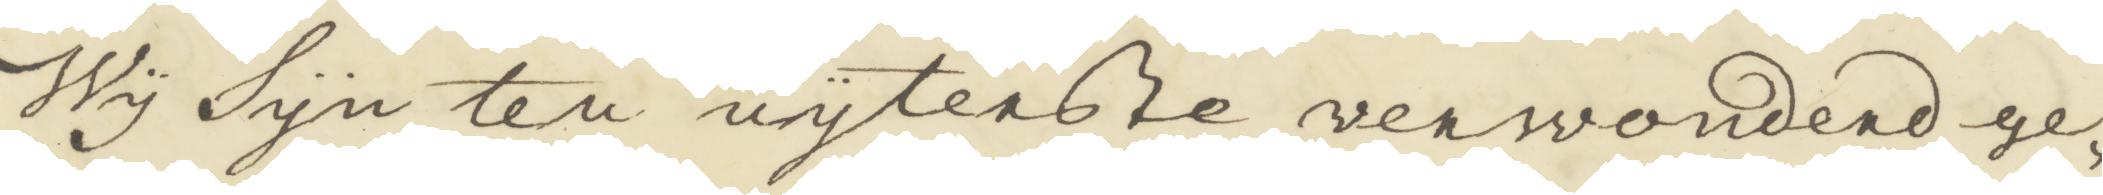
Wij Sijn ten uijterste verwonderd ge„
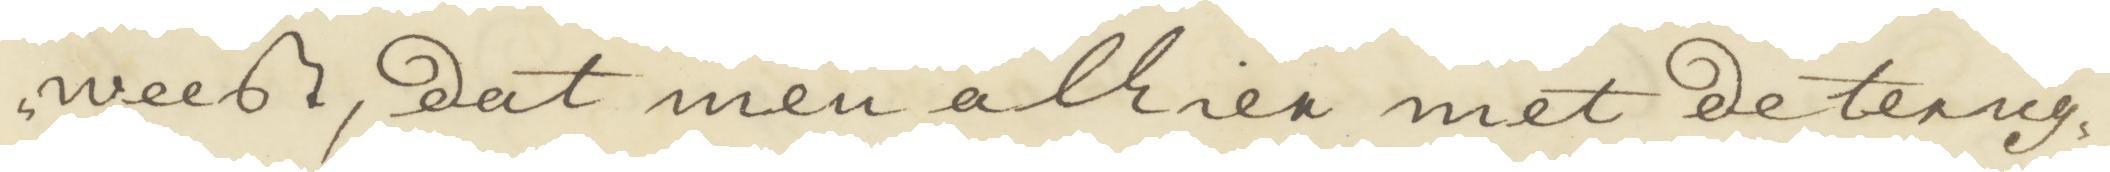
weest, dat men alhier met de terug„
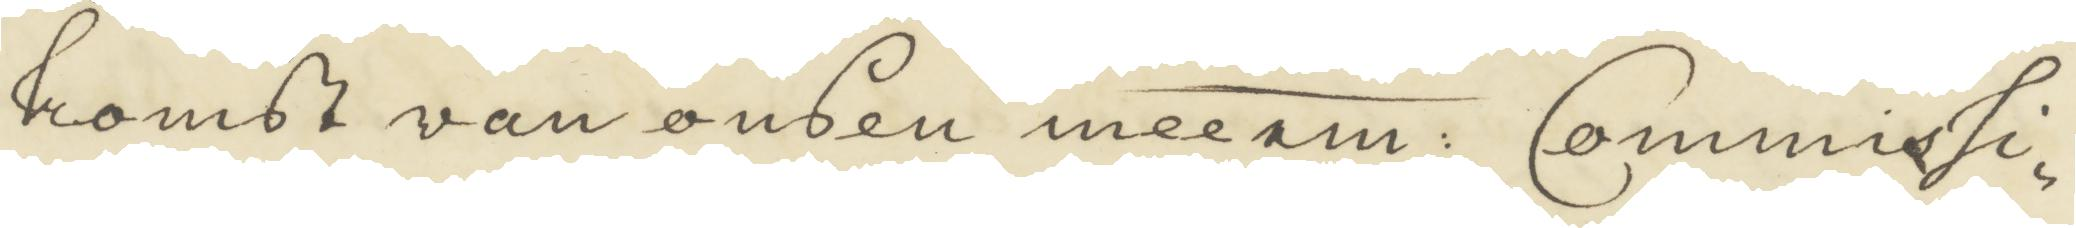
komst van onsen meerm: Commissi„
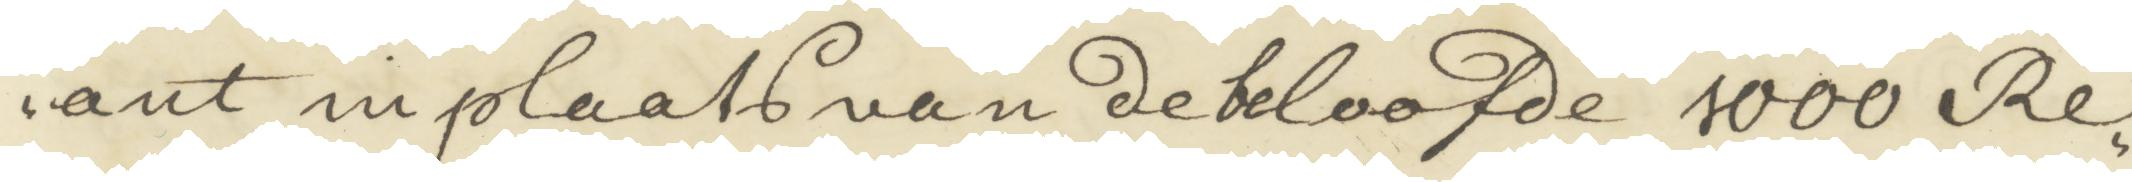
„ant in plaats van de beloofde 1000 Re„
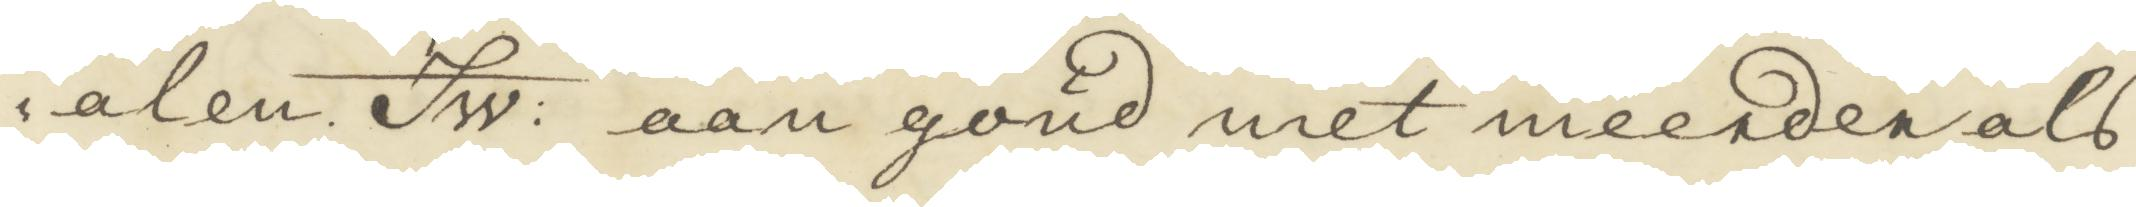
„alen Sw: aan goud niet meerder als
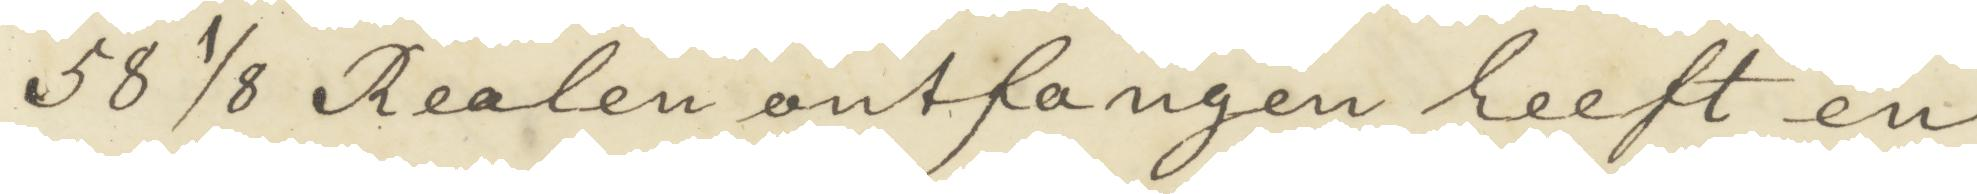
58 1/8 Realen ontfangen heeft en
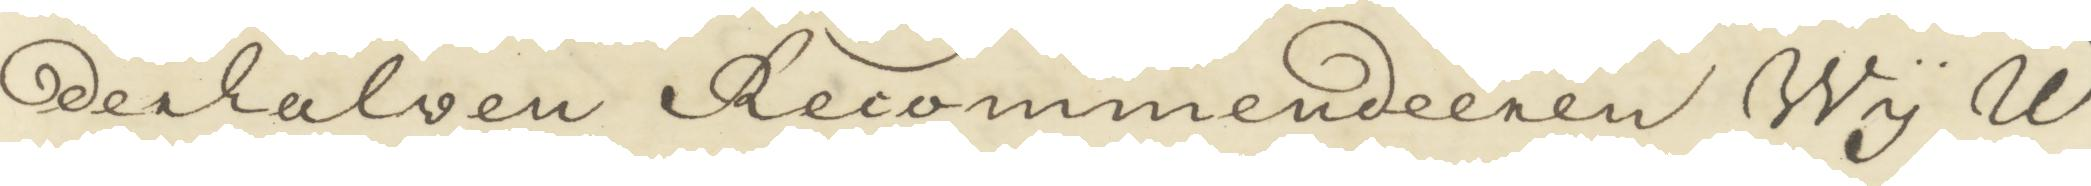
derhalven Recommendeeren Wij U
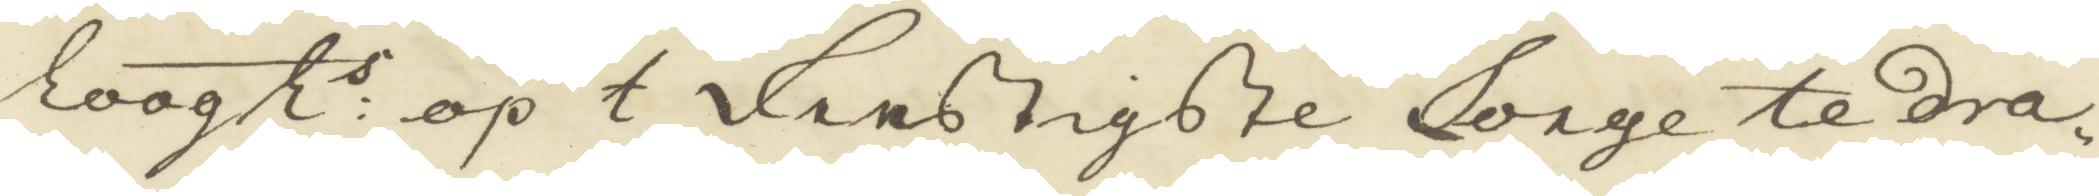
hoogh:s op ’t Ernstigste Sorge te dra„
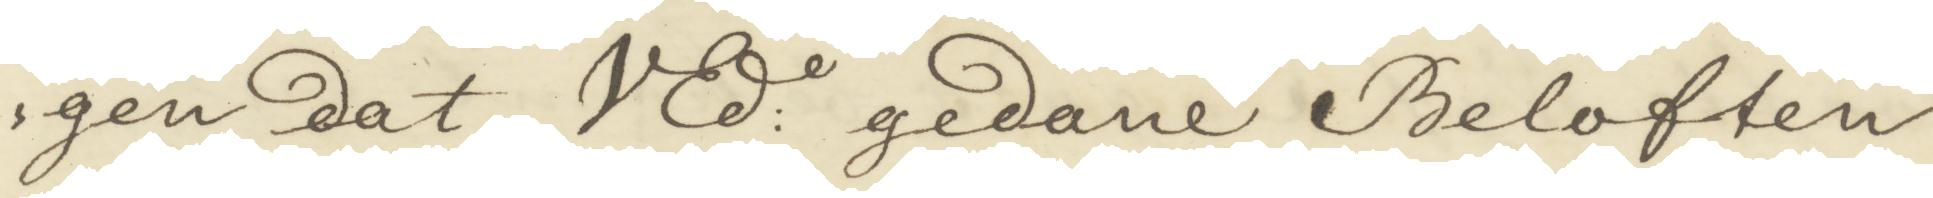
„gen dat VEd:e gedane Beloften
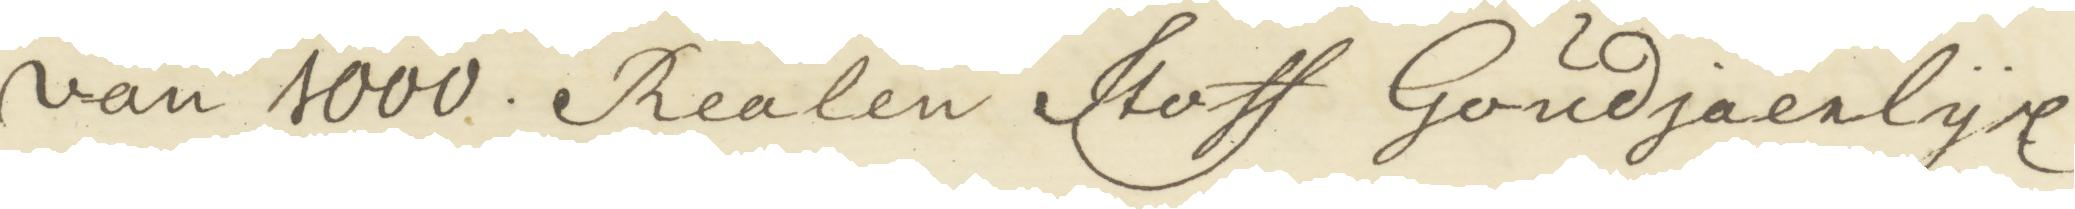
van 1000. Realen Stoff Goud jaerlijx
